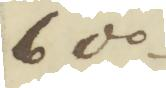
6 do
